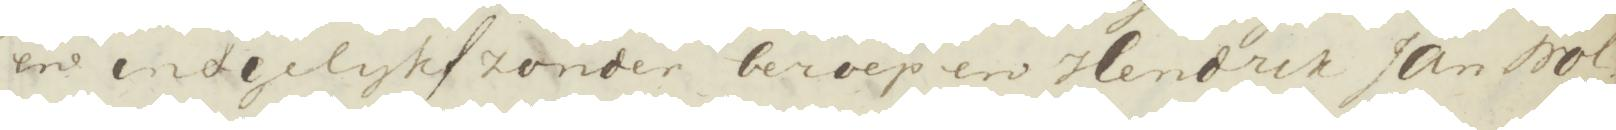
en insgelijks zonder beroep en Hendrik Jan Wol
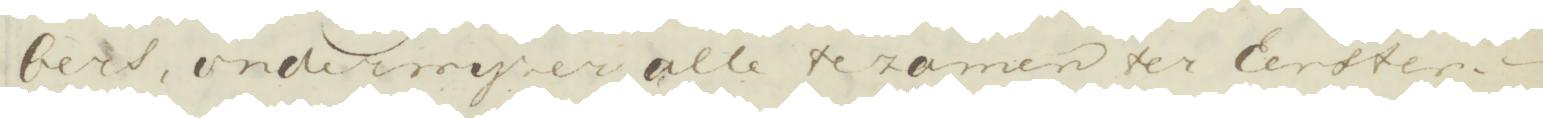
bers, onderwyzer, alle te zamen ter Eerster. —
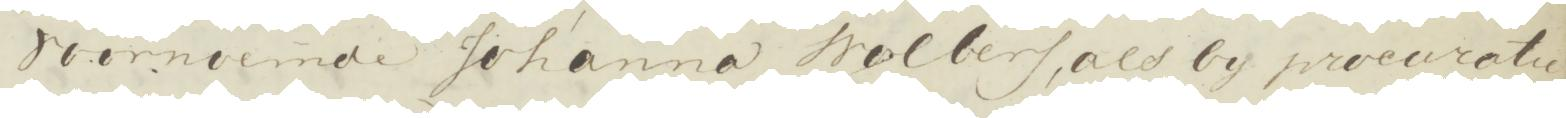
Voornoemde Johanna Wolbers, als by procuratie
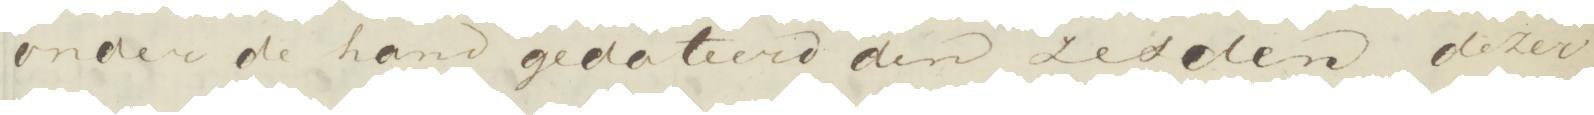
onder de hand gedateerd den zesden dezer
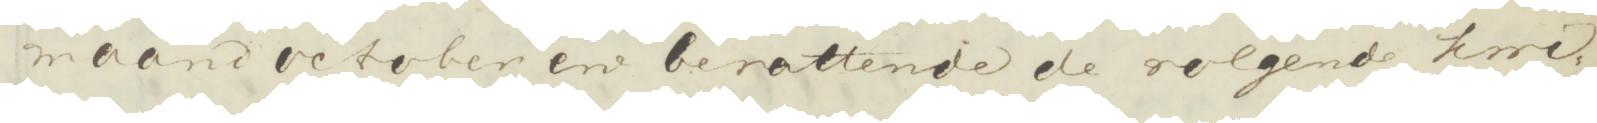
maand october en bevattende de volgende kwi„
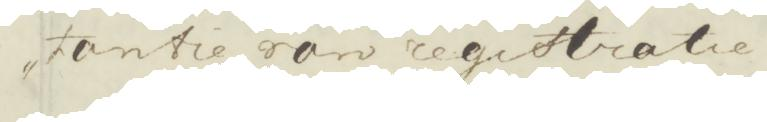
„tantie van registratie
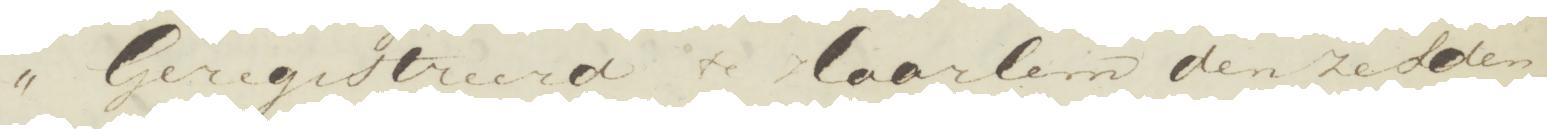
„ Geregistreerd te Haarlem den zesden
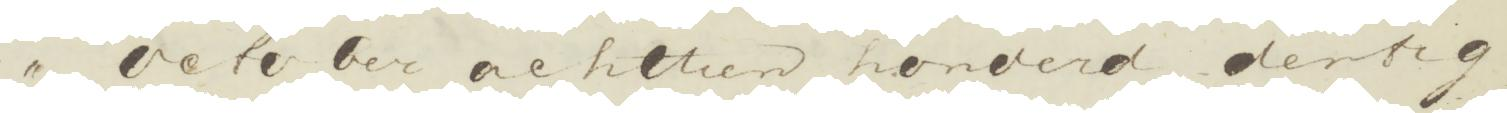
„ October achttien honderd dertig
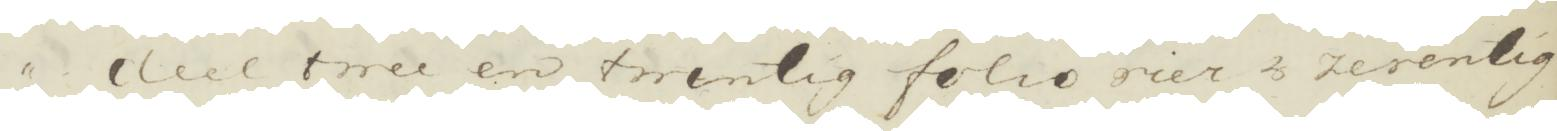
„ deel twee en twintig folio vier en zeventig
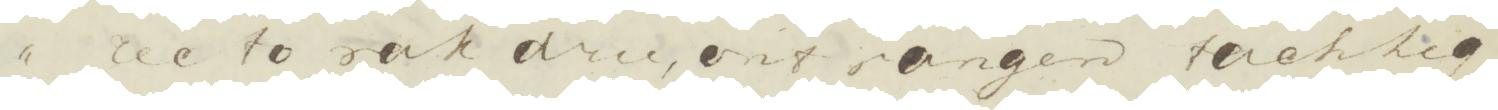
„ recto vak drie, ontvangen tachtig
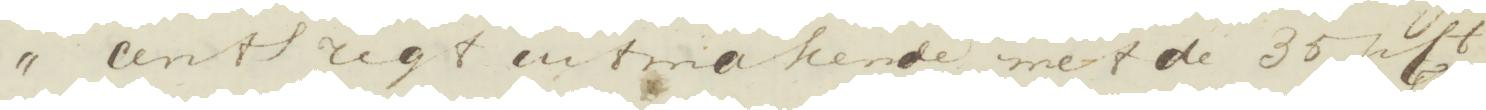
„ cents regt uitmakende met de 35 pCt
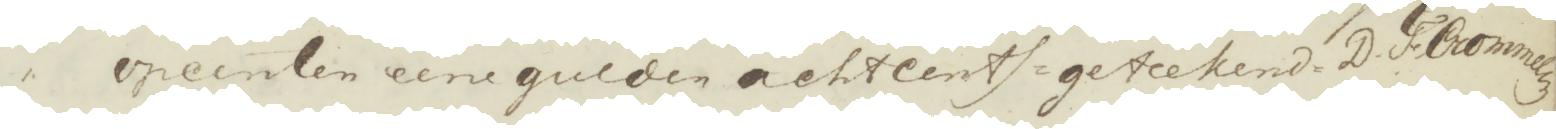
„ opcenten eene gulden acht cents = geteekend. D. F: Crommelin
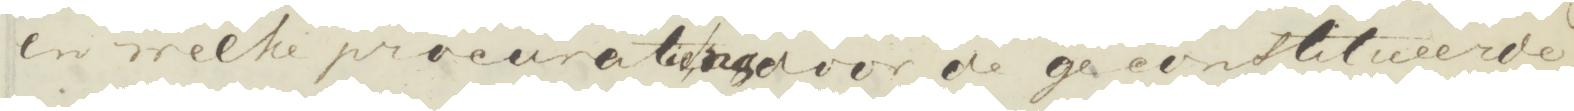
en welke procuratie, na door de geconstitueerde
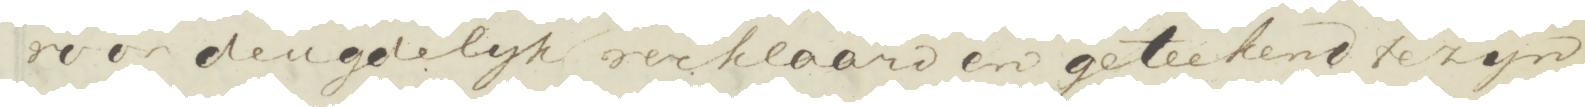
voor deugdelyk verklaard en geteekend te zyn
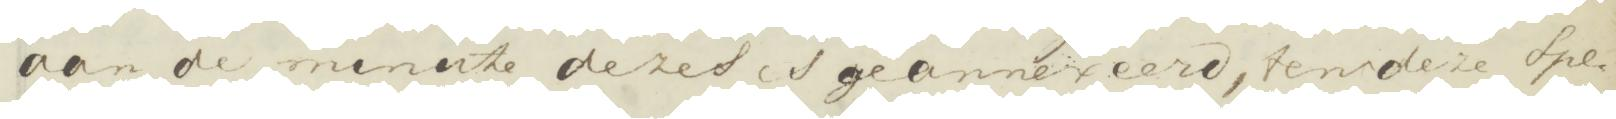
aan de minute dezes is gëannexeerd, ten deze spe„
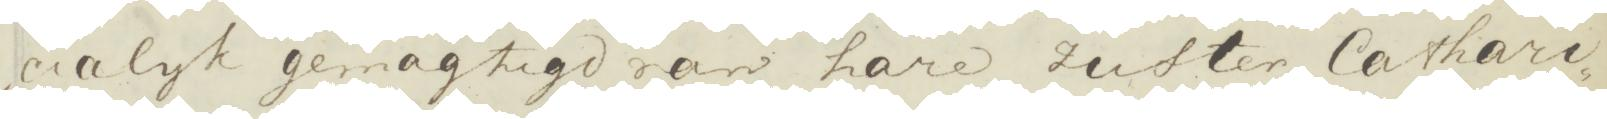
cialyk gemagtigd van hare Zuster Cathari„
